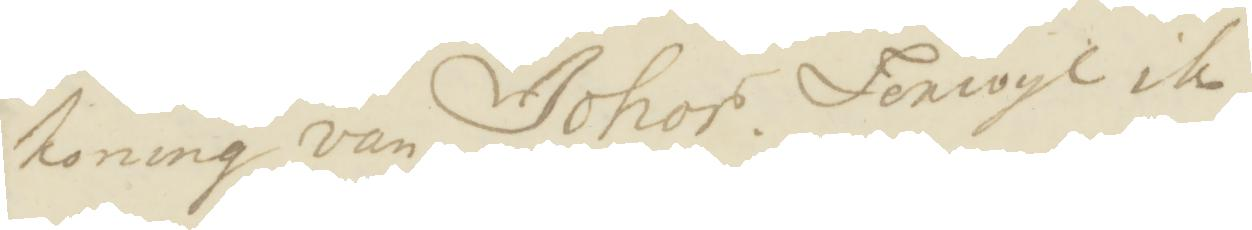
koning van Iohor, Terwyl ik
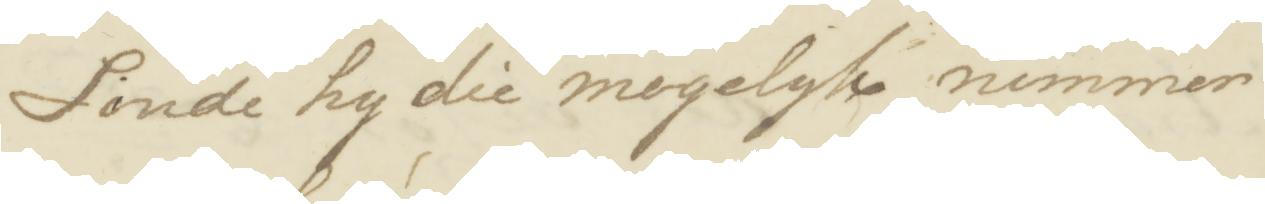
Soude hy die mogelyk nimmer
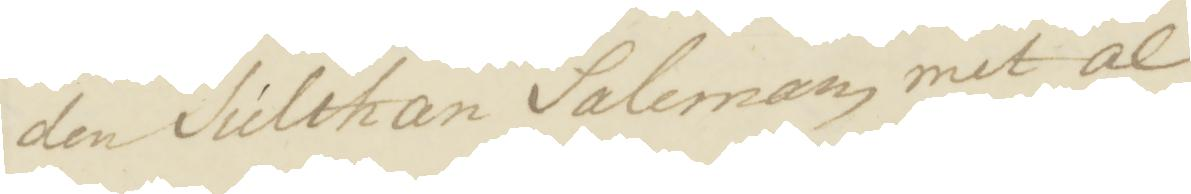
den Sulthan Saleman met al
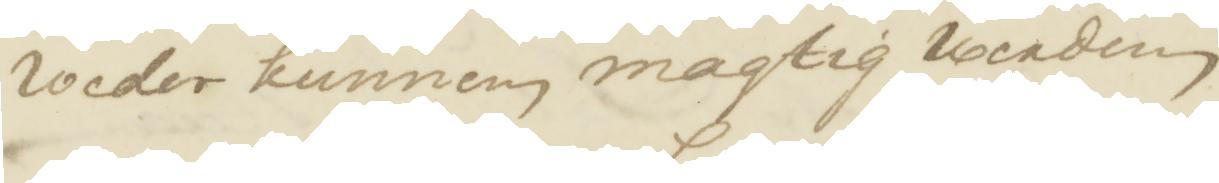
weder kunnen magtig werden
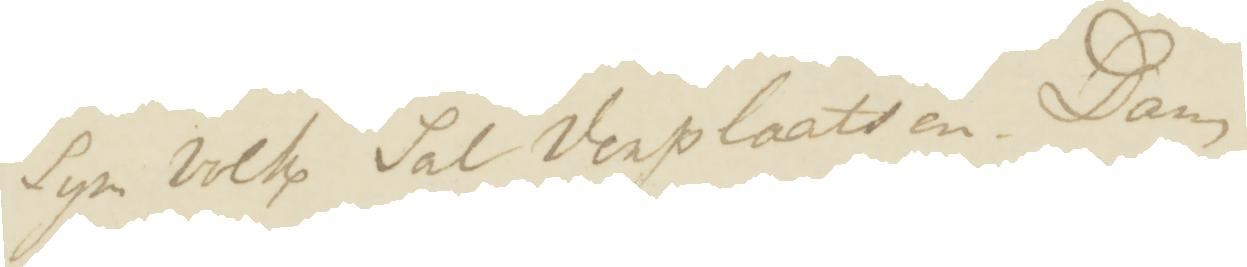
syn volk Sal verplaatsen. Dan
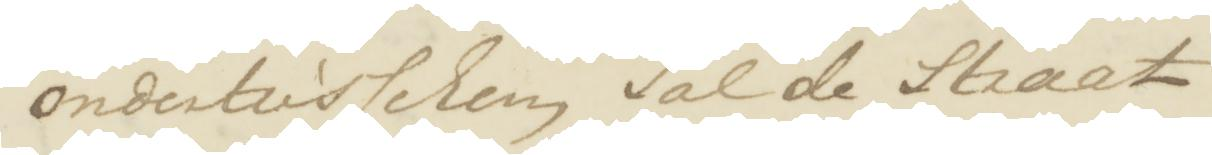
ondertusschen Sal de Straat
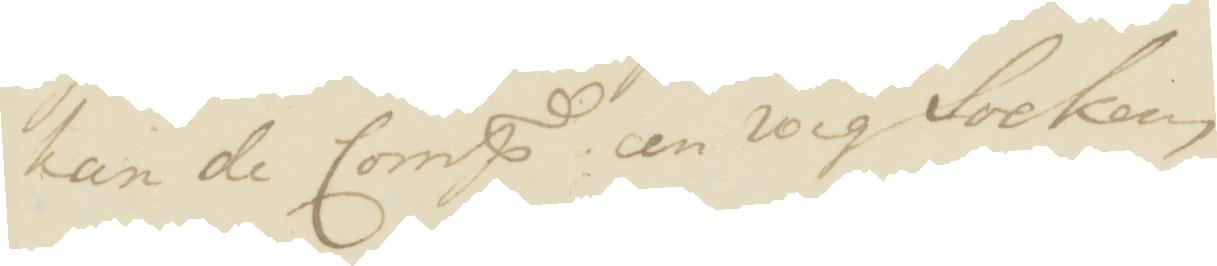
kan de Comp:e een weg Soeken
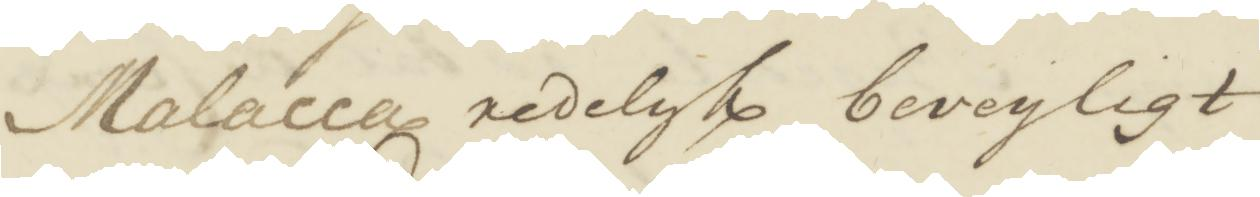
Malacca redelyk beveijligt
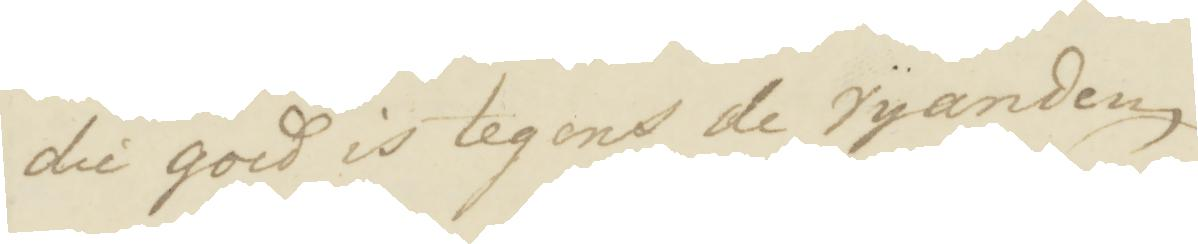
die goed is tegens de vijanden
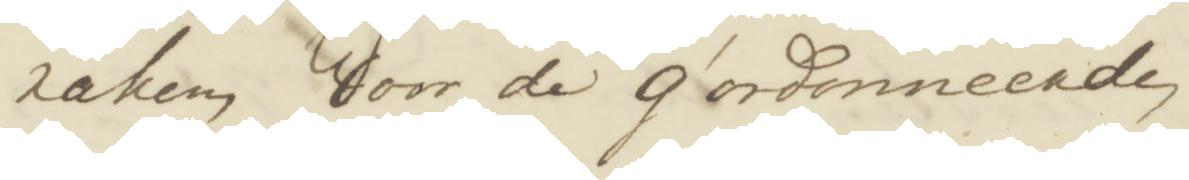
raken door de g'ordonneerden
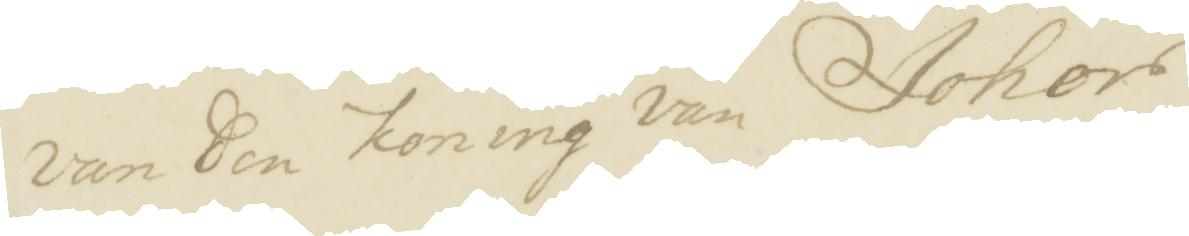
van den koning van Iohor
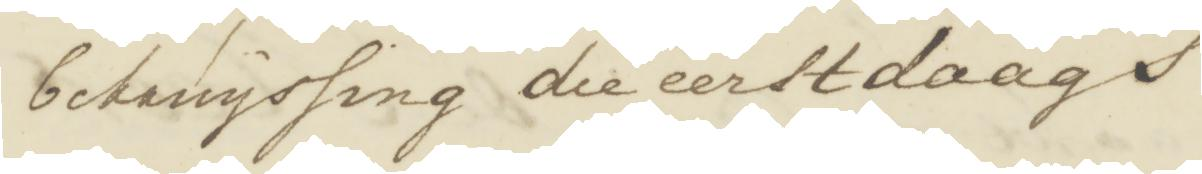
bekruijssing die eerst daags
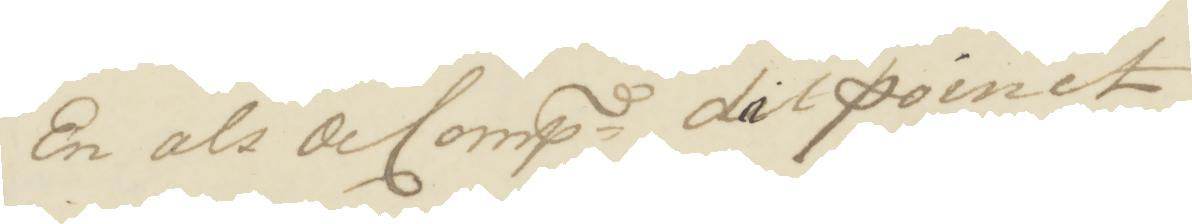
En als de Comp:e dat poinct
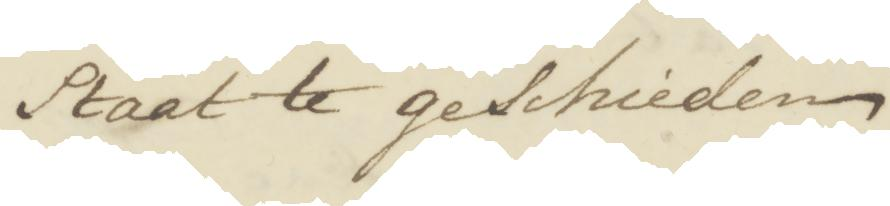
staat te geschieden
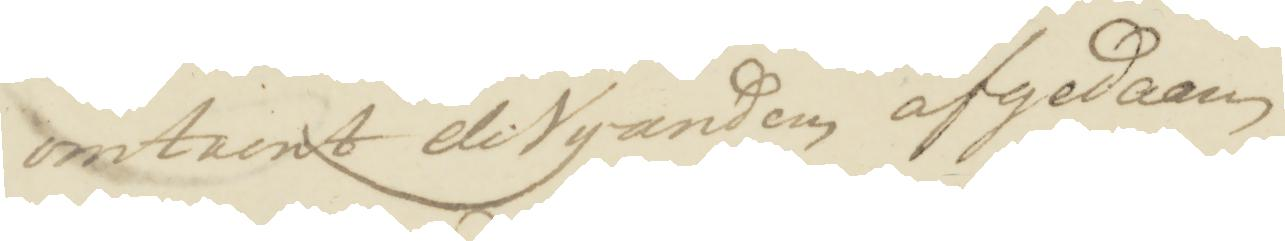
omtrent di Vyanden afgedaan
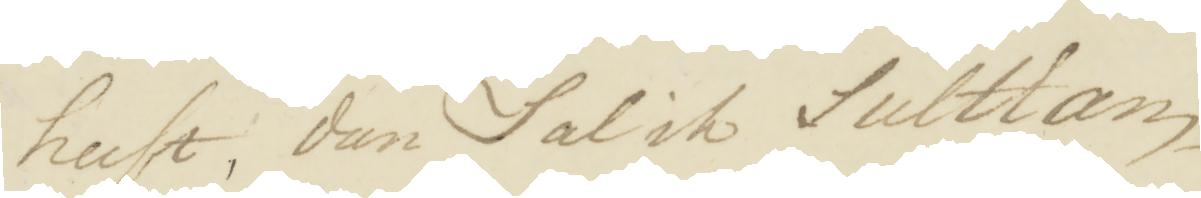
heeft, dan Sal ik Sulthan
